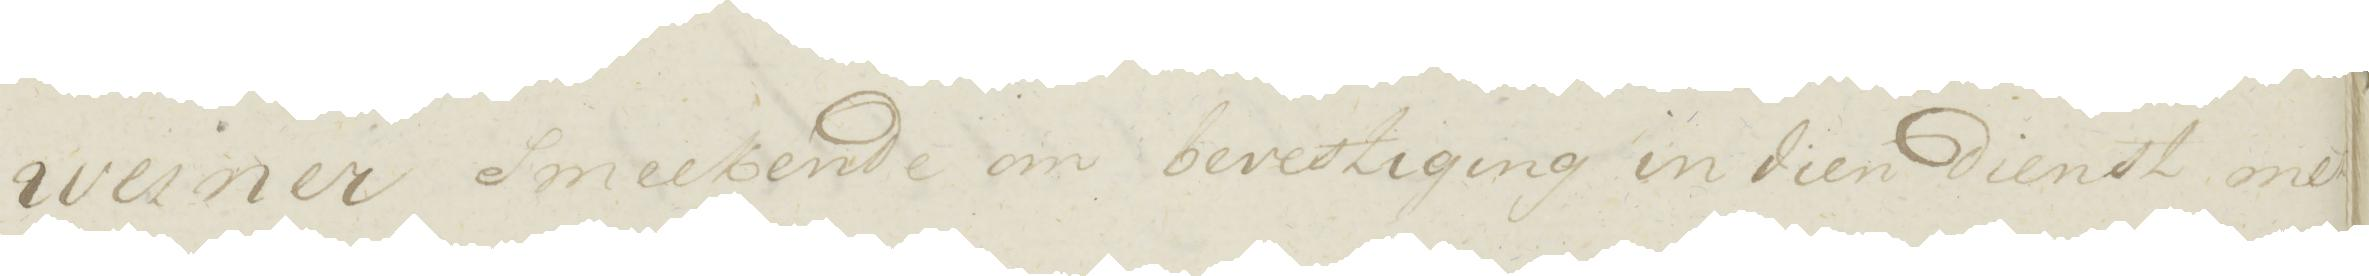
weiner smeekende om bevestiging in dien dienst met
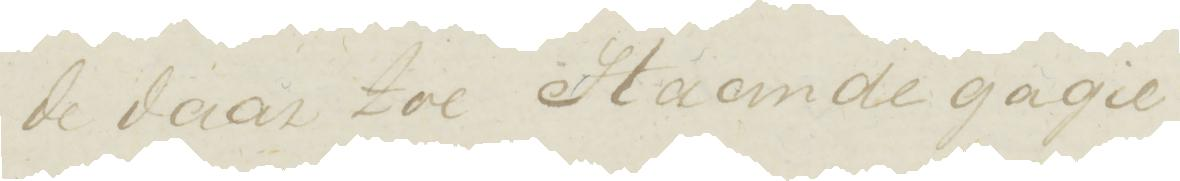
de daar toe staande gagie
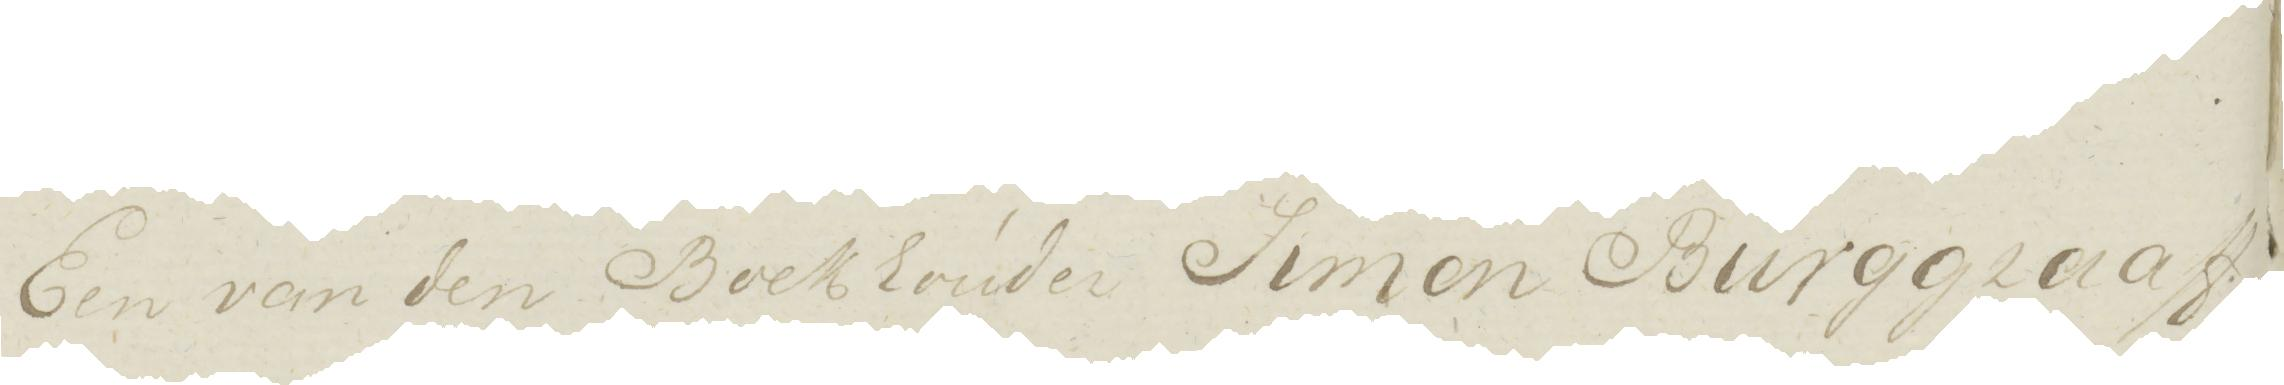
Een van den Boekhouder Simon Burggraaff
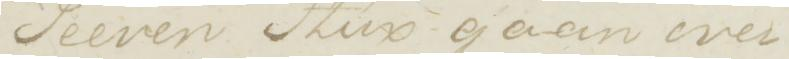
seeven stux gaan over
